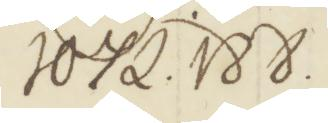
1072.18 8.
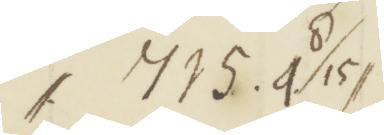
„ 715.4 8/15 „
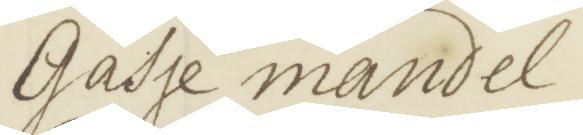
Gasje mandel
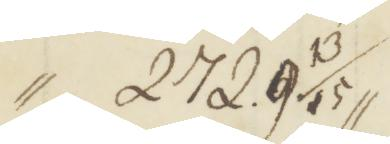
„ 272.9 13/15„
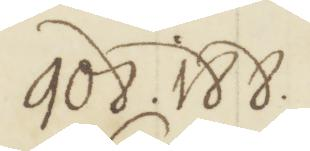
408.18 8.
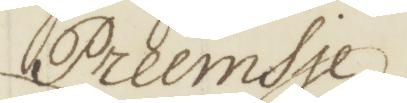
Preemsje
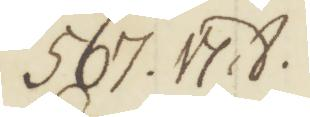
567. 17.8.
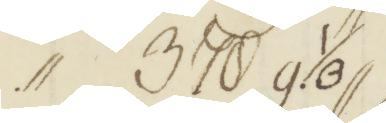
„ 378 9 1/3 „
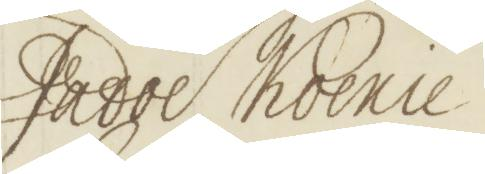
Jadoe Koerie
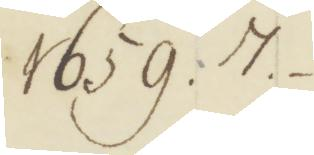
1659:7:-
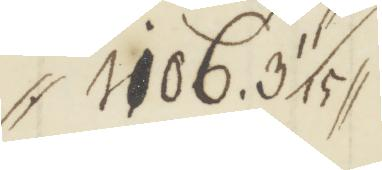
ƒ 1106.3 1/15 „
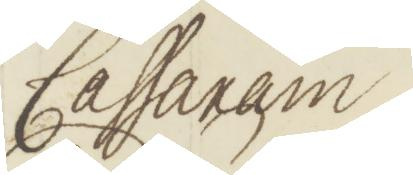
Cassaram
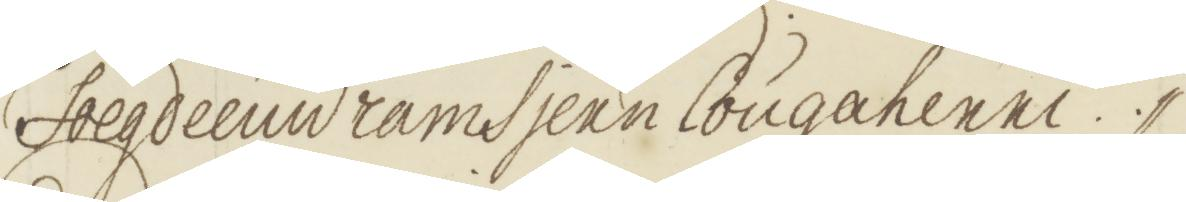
Soegdeeuw ramsjern Cougakerri. . „
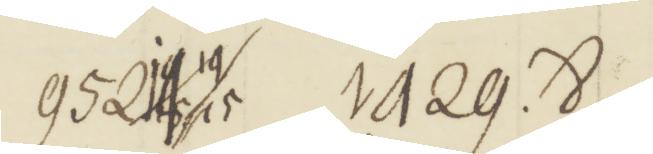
95214 14/15 1429:8:
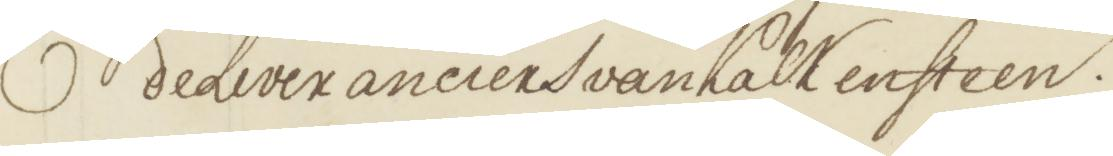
de Leveranciers van Kalk en Steen.
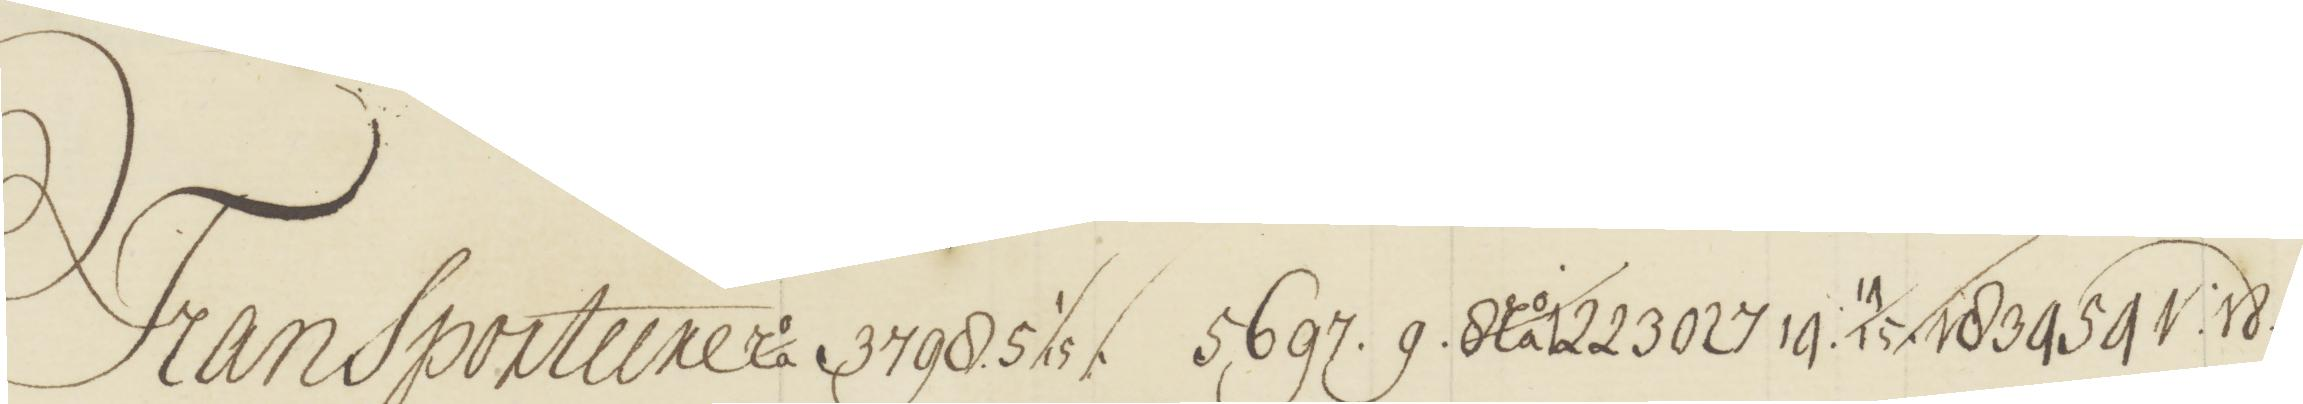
Transporteere r:o/a: 3798.5 1/15 /. 5697. 9. 8r:o/a 1223027 14: 14/15. /.1834541:18.
